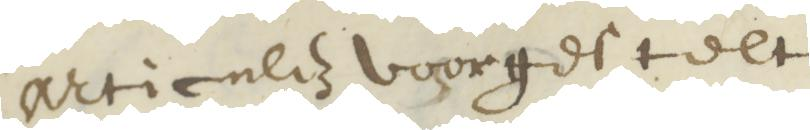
articulen voorgestelt
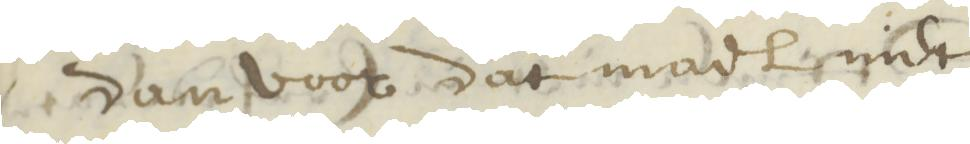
dan voor dat mael niet
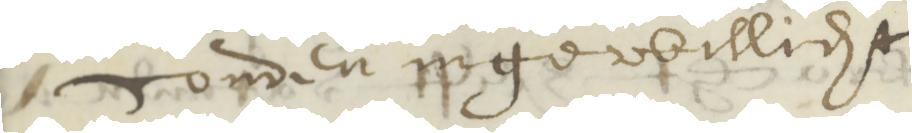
konden ingewillicht
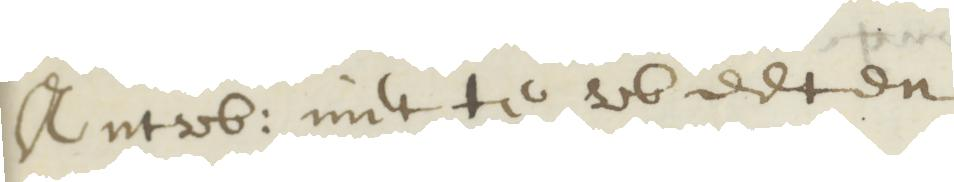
Antw: niet te weeten
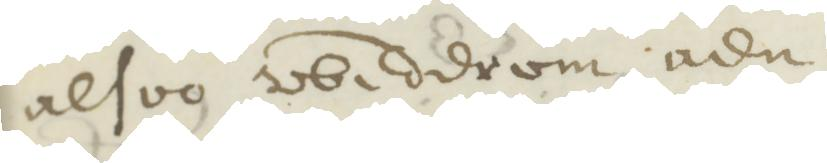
alsoo wederom aen
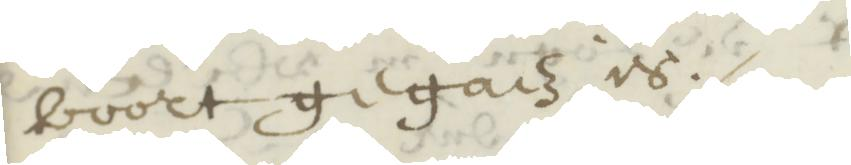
boort gegaen is./
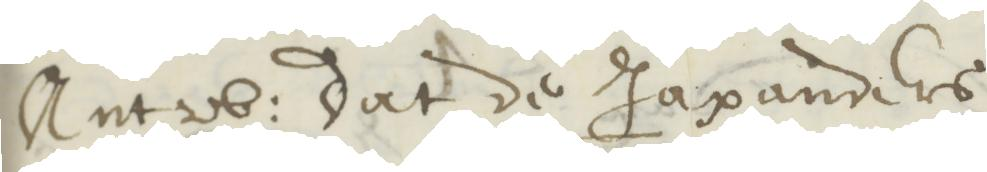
Antw: dat de Japanders
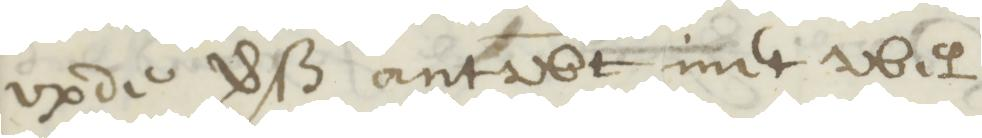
op de versz antwt niet wel
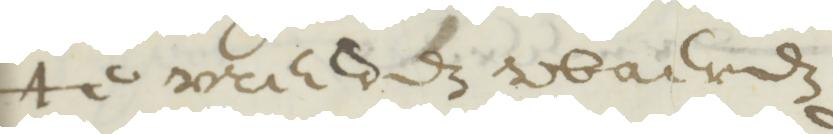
te vreeden waeren
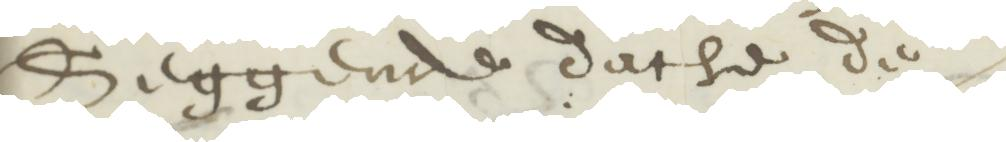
Zeggende datse de
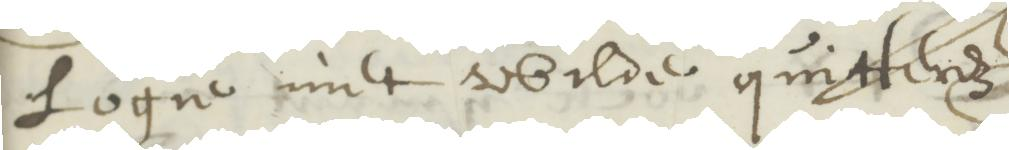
Logie niet wilde quitteren
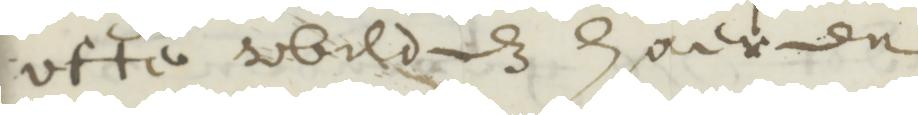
ofte wilden haeren
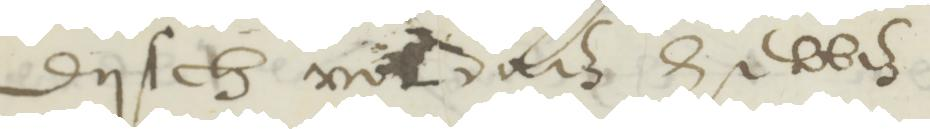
eysch voldaen hebben
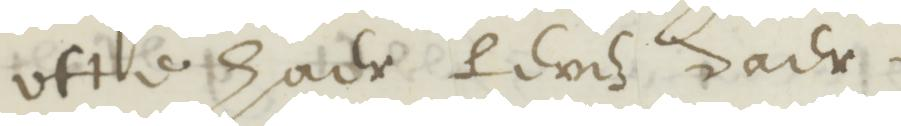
ofte haer leven daer
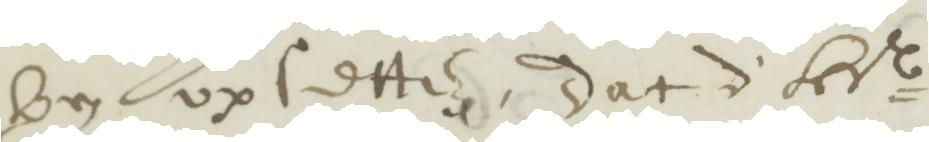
by op setten, dat d’ h=r
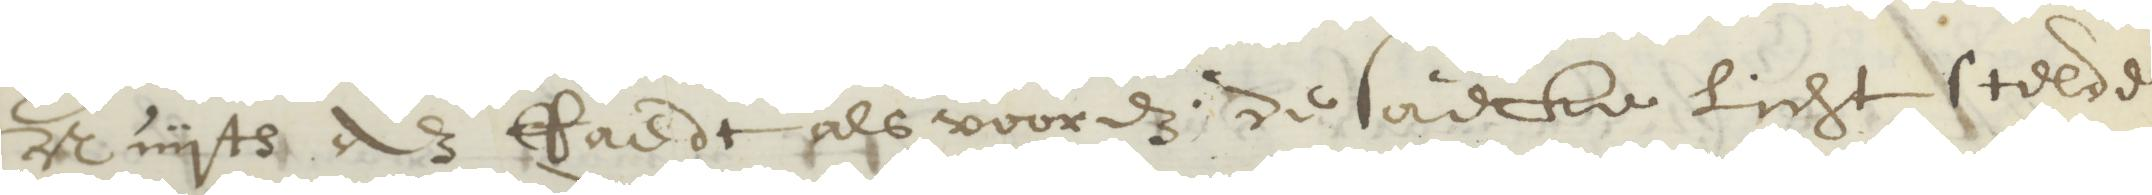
Nuijts den Raedt als voor en de saecke licht stelde
